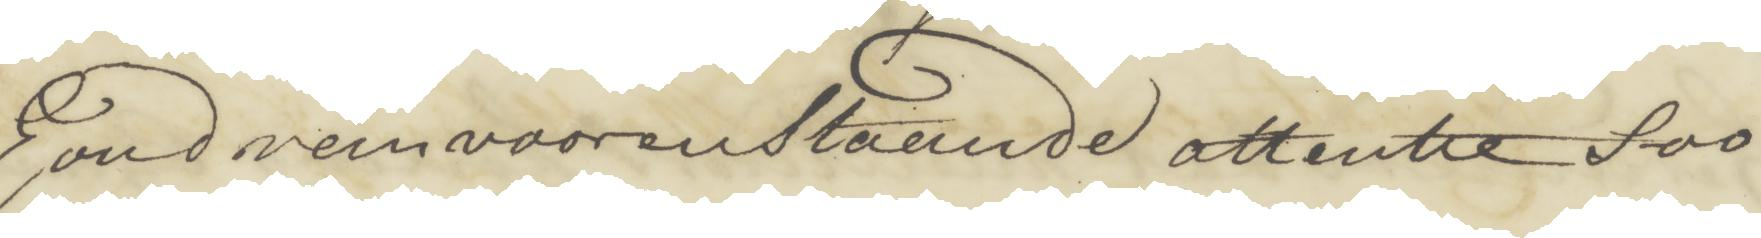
houd van voorenstaande attentie soo
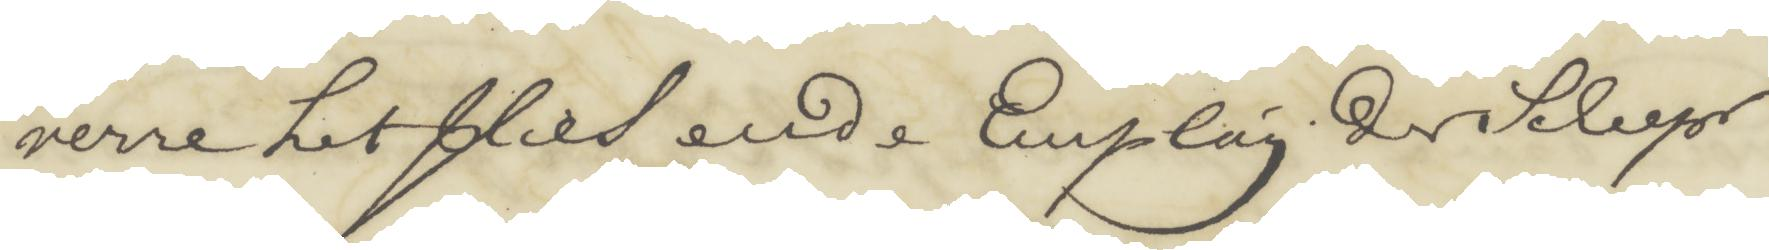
verre het verlies ende Emploij der scheeps
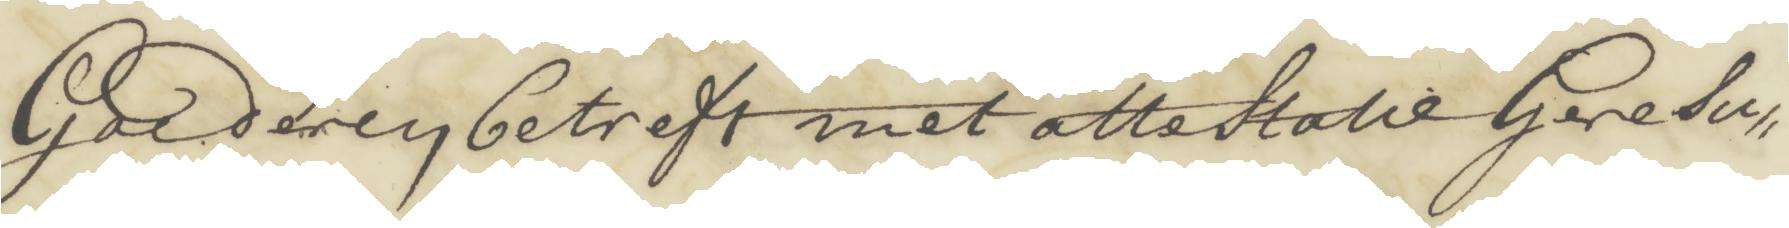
Goederen betreft met attestatie Geresu„
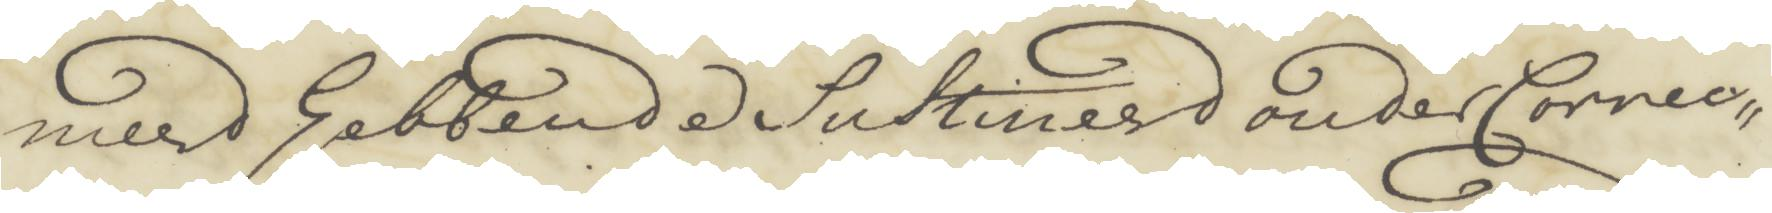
meerd hebbende sustineerd ouder Correc„
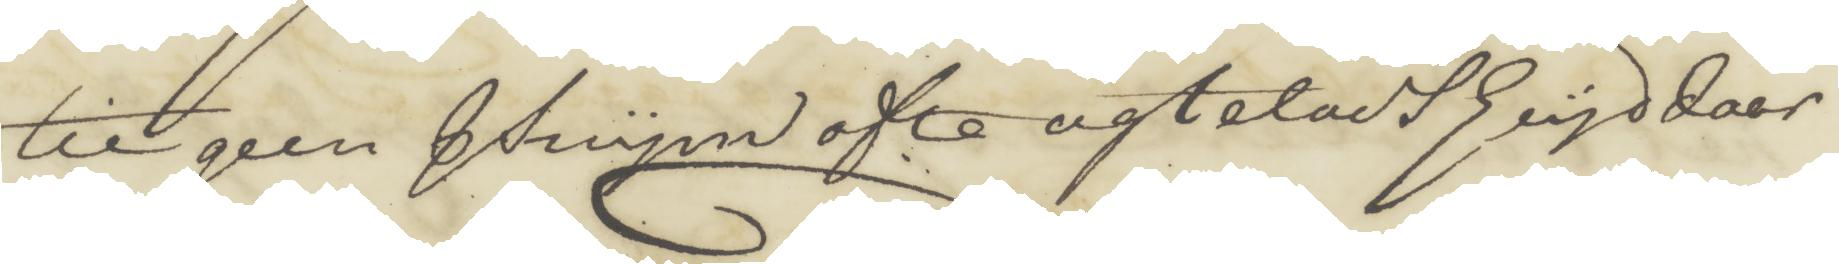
tie geen versuijm ofte agteloosheijd daer
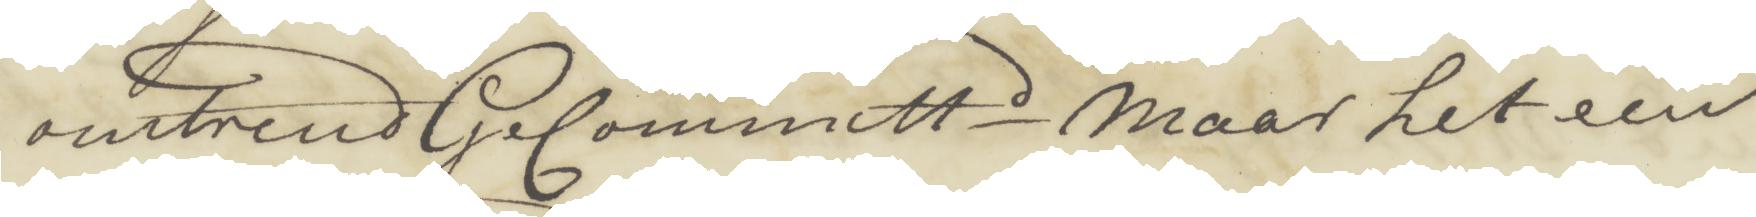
omtrend Gecommitt–d maar het een
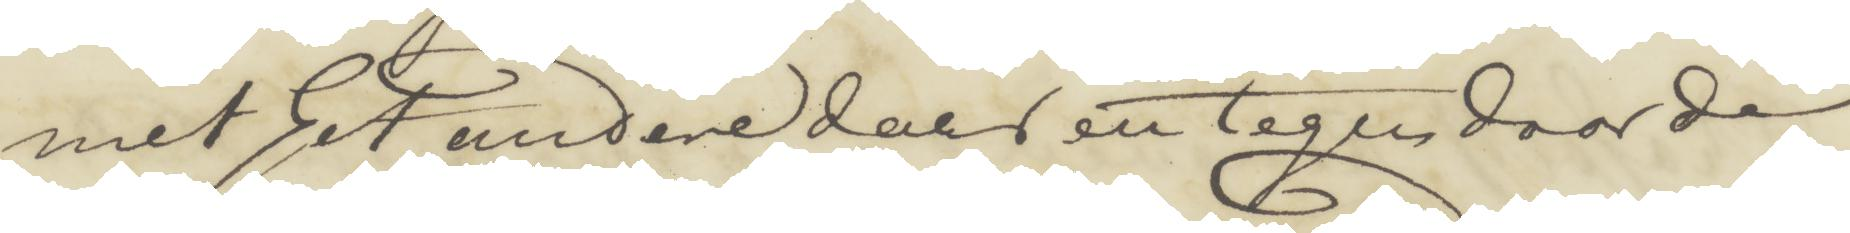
met het andere daar en tegen door de
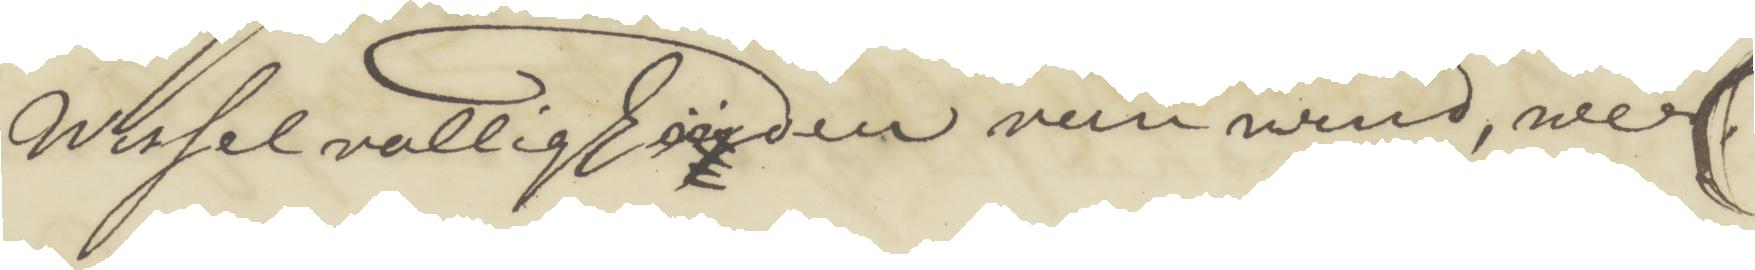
wissel valligheeden van wind, weer
